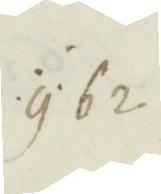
962
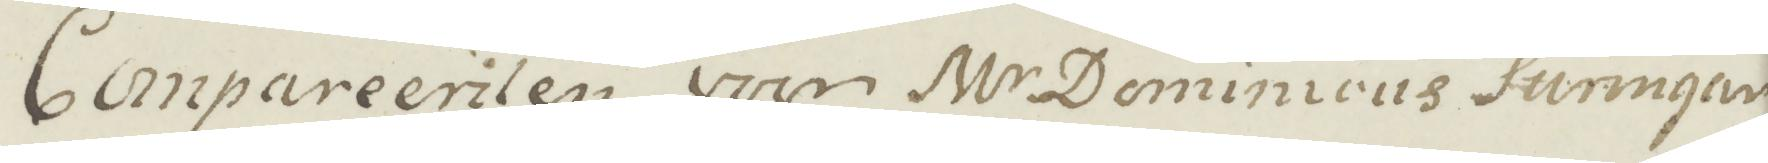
Compareerden voor Mr Dominicus Suringar
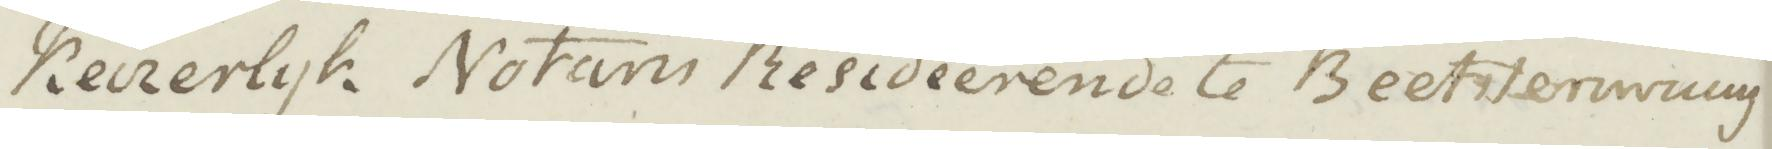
Keizerlyk Notaris Resideerende te Beetsterzwaag
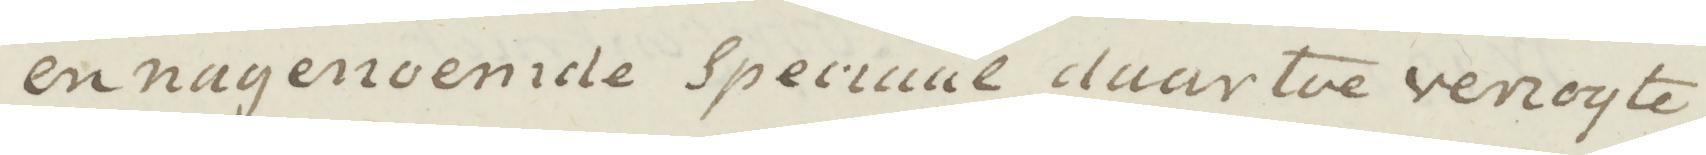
en nagenoemde speciaal daar toe verzogte
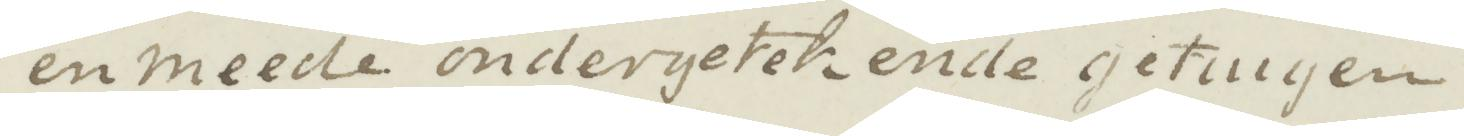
en meede ondergetekende getuigen
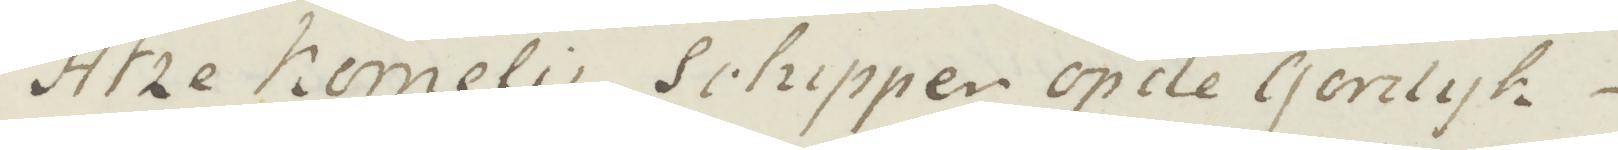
Atze Kornelis Schipper op de Gordyk -
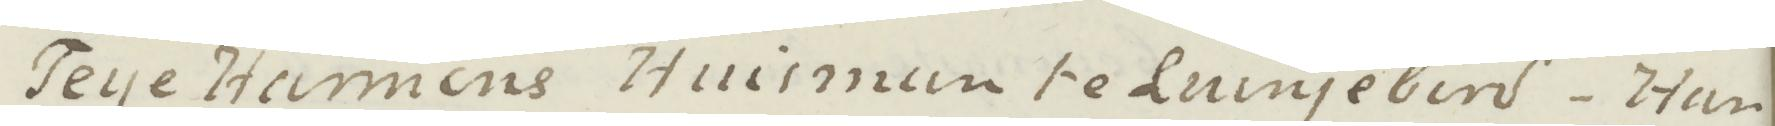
Teye Harmens Huisman te Luinjebird - Har
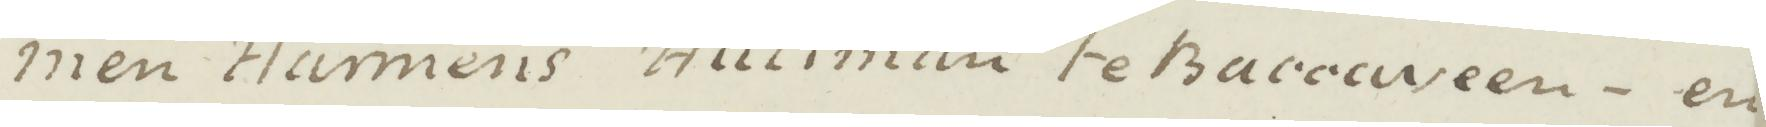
men Harmens Huisman te Barraveen - en
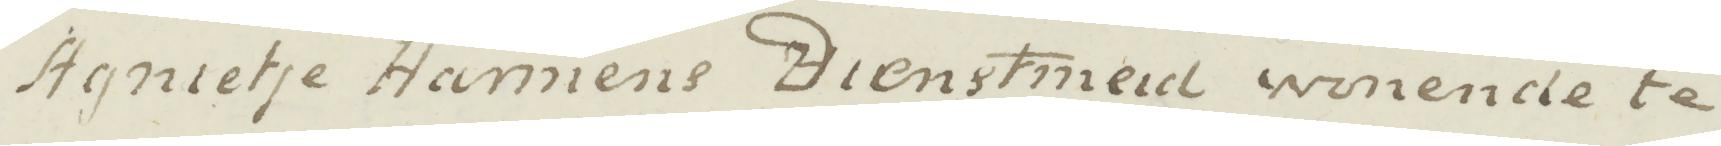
Agnietje Harmens Dienstmeid wonende te
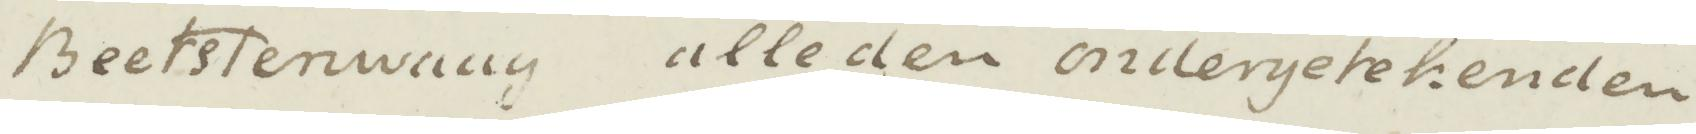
Beetsterzwaag alle den ondergetekenden
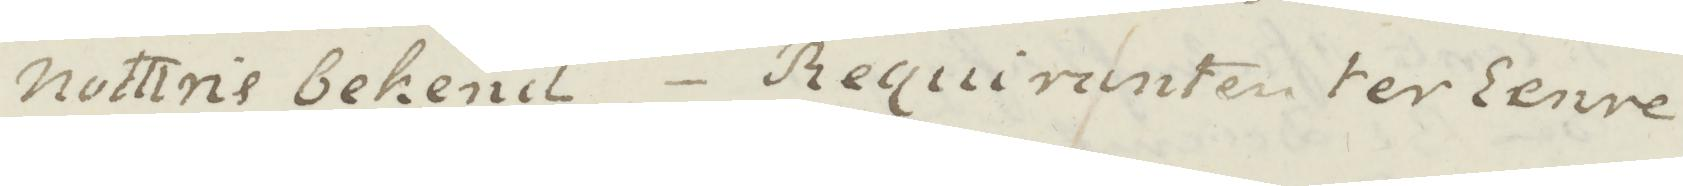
notaris bekend - Requiranten ter Eenre
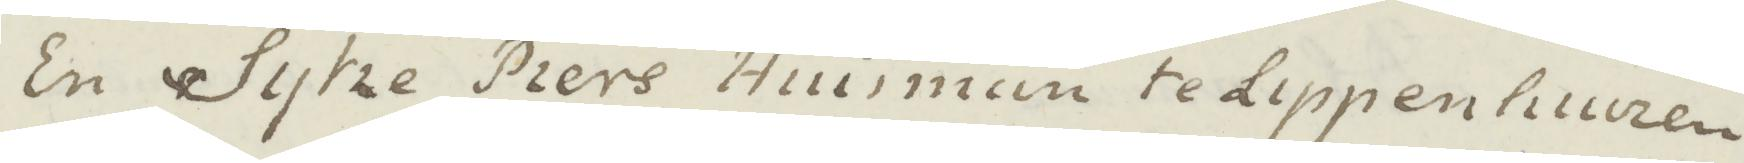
En Syke Piers Huisman te Lippenhuizen
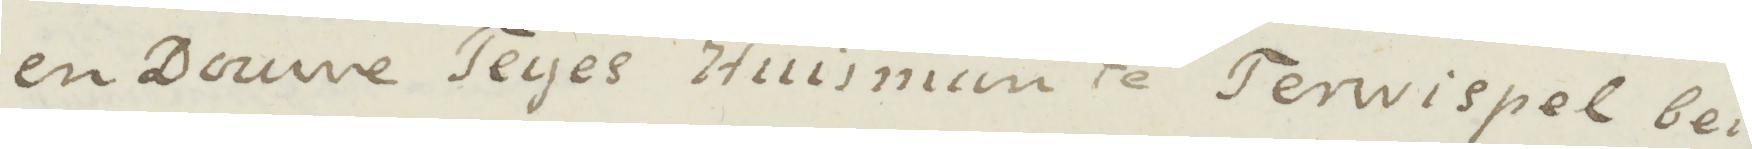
en Douwe Teyes Huisman te Terwispel bei
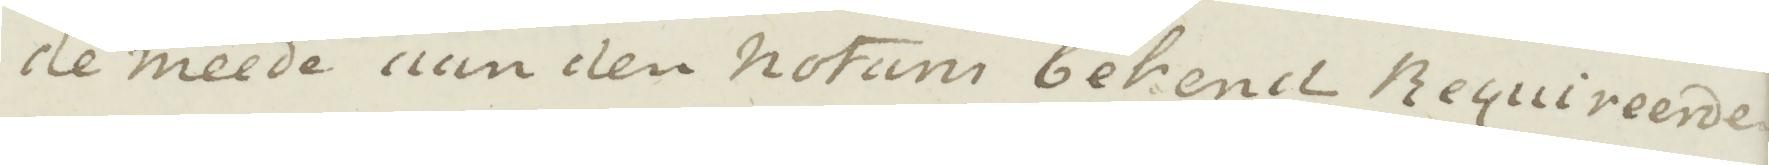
de meede aan den notaris bekend Requireerde
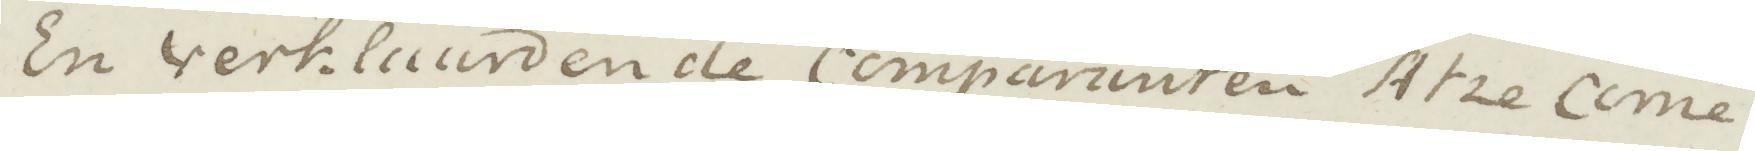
En verklaarden de comparanten Atze Corne
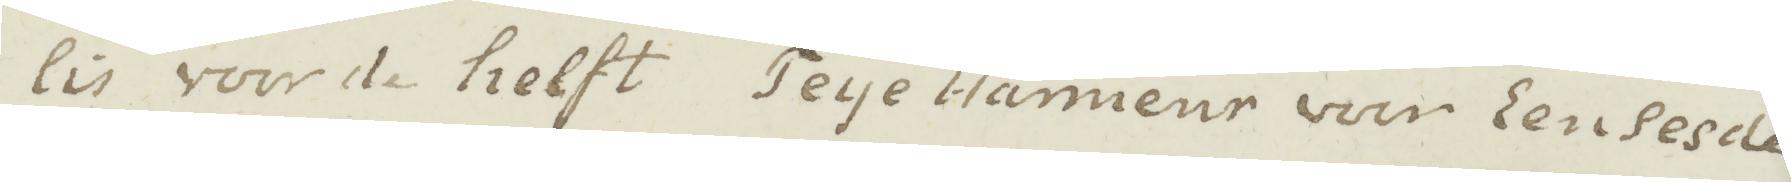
lis voor de helft Teye Harmens voor Een sesde
